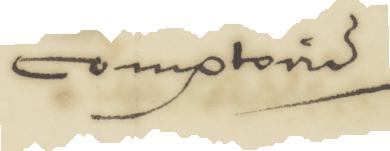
comptoire
